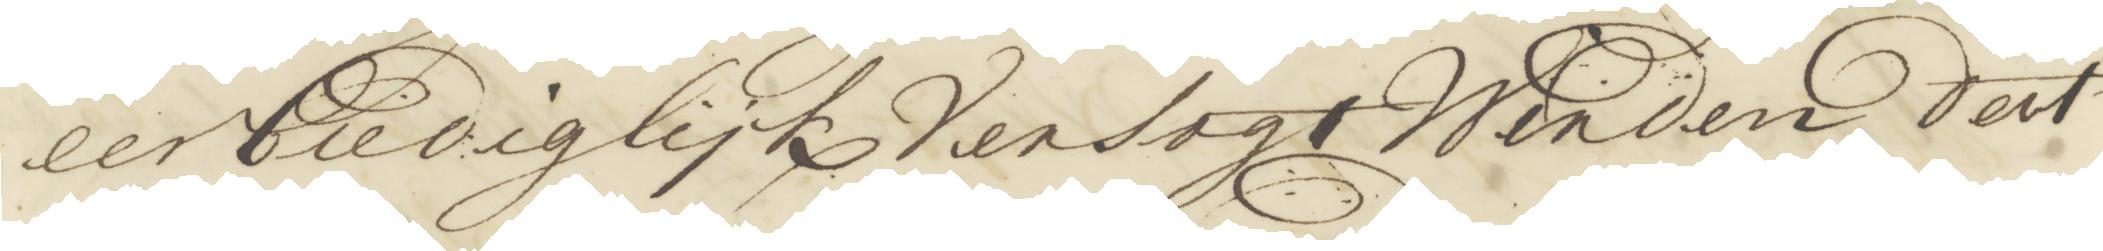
eerbiediglijk versogt werden dat
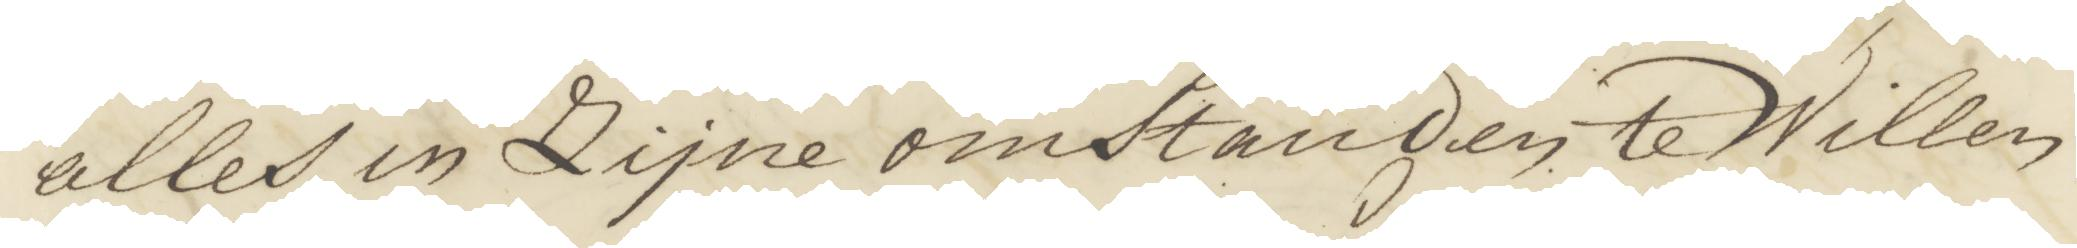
alles in zijne omstanden te Willen
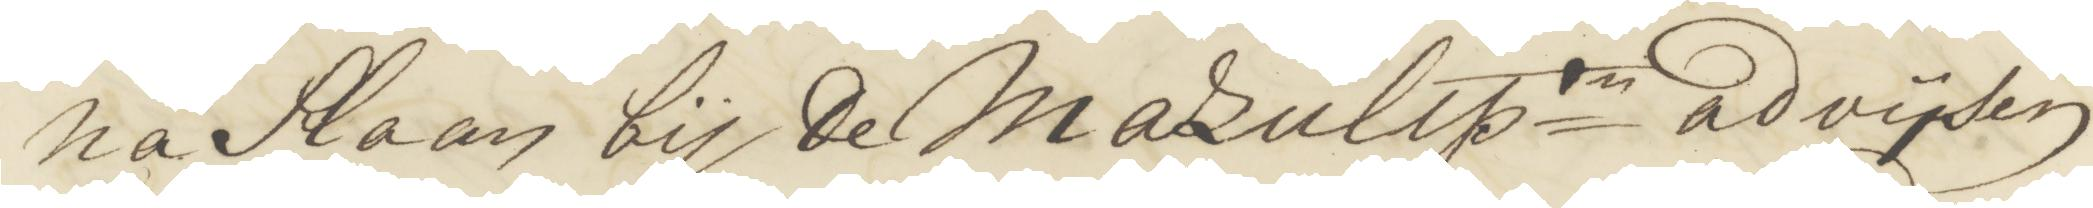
na slaan bij de Mazulip=tn advijsen
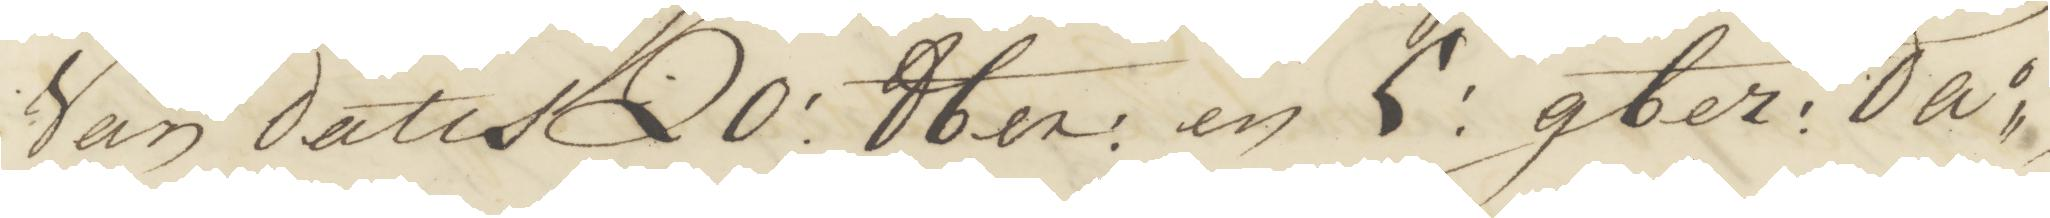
van datis 20: 8ber: en 5: 9ber: da„o
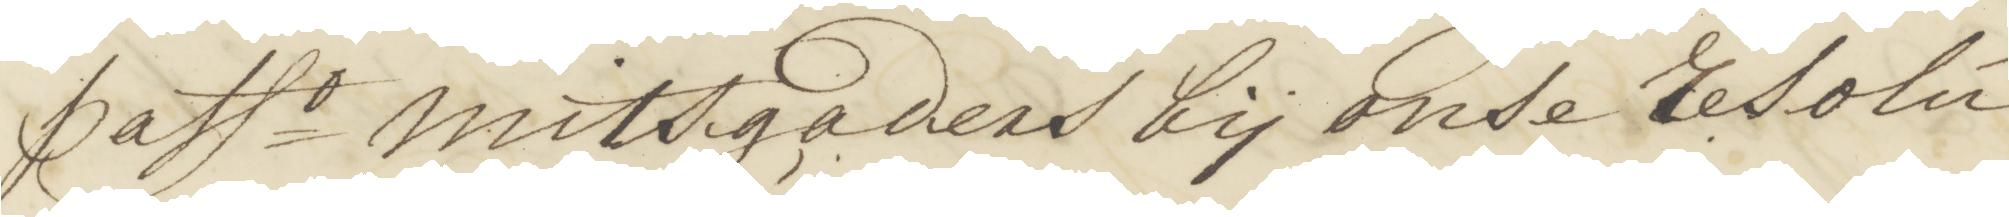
pass=o mitsgaders bij onse resolu
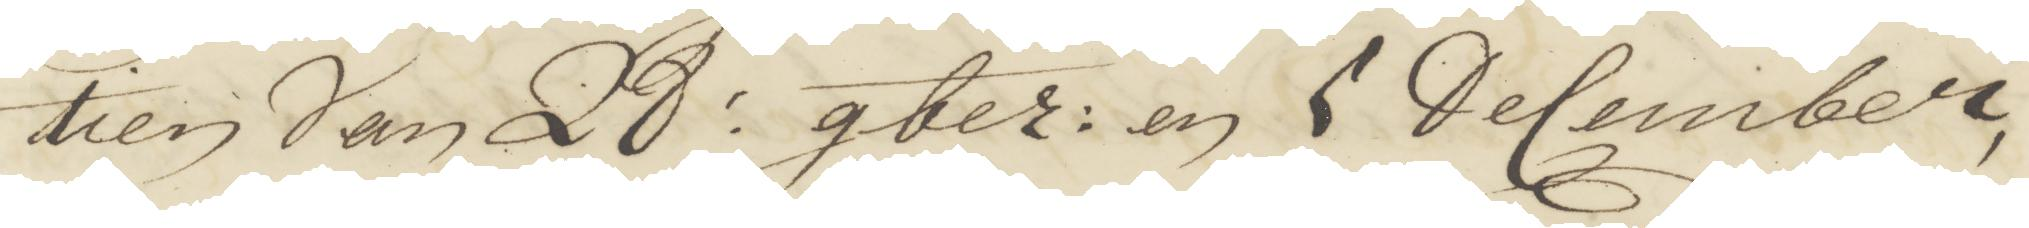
tien van 28:' 9ber: en 5 december,
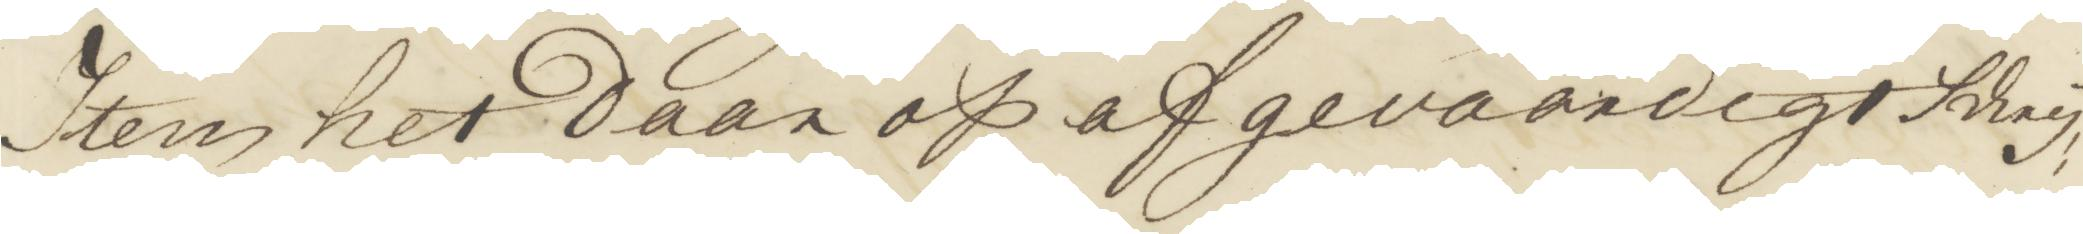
Item het daar op afgevaardigt schrij„
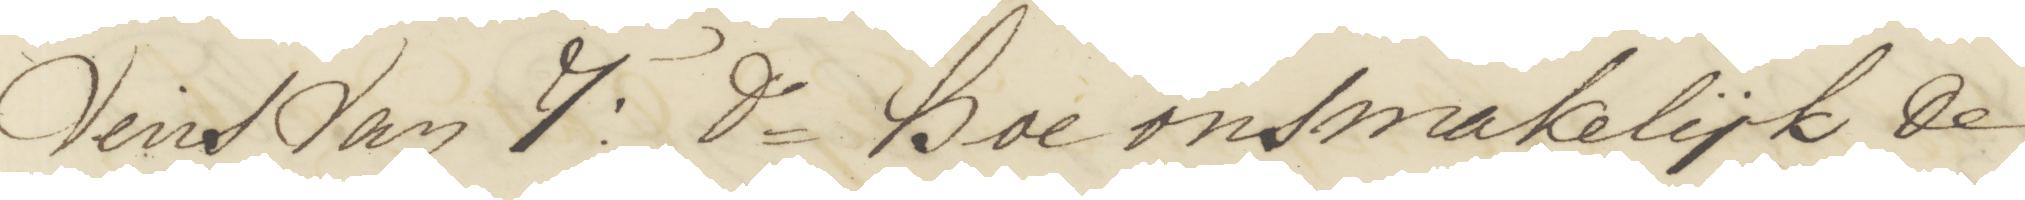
vens van 7:' d=o hoe onsmakelijk de
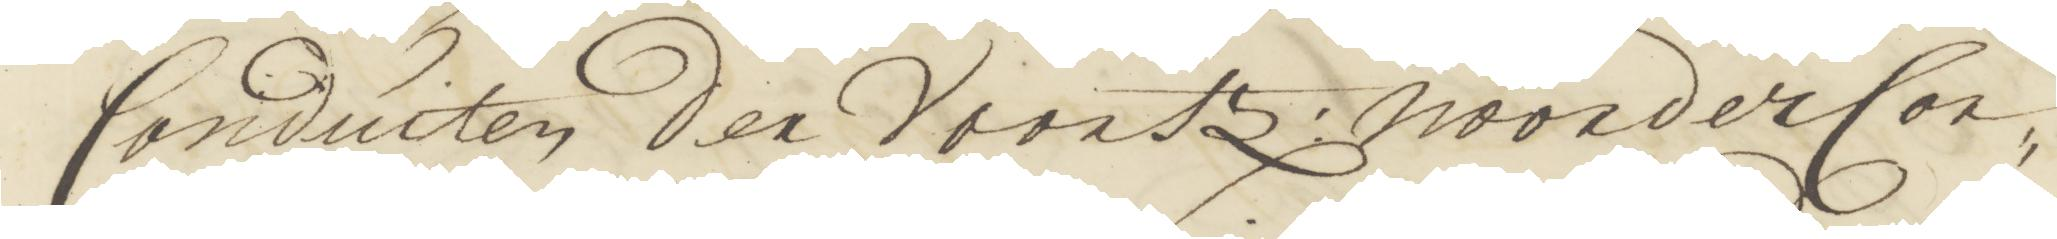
Conduiten der voorsz: noorder Cor
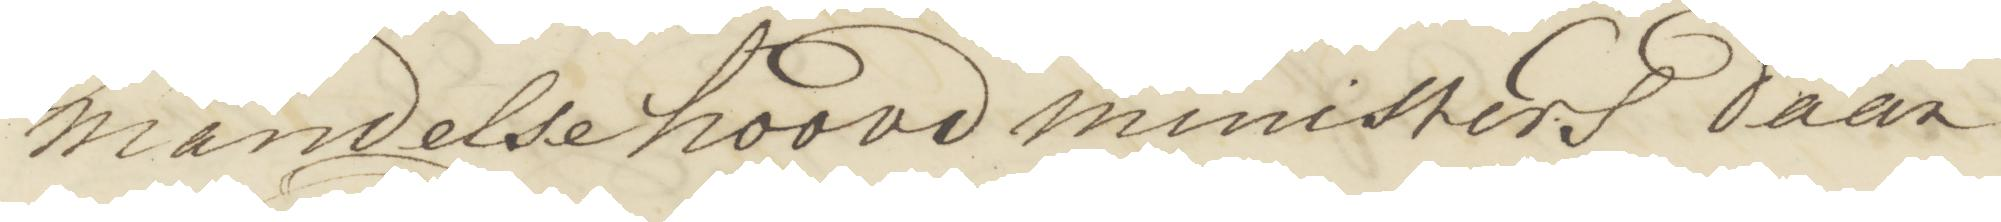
mandelse hoovd ministers daar
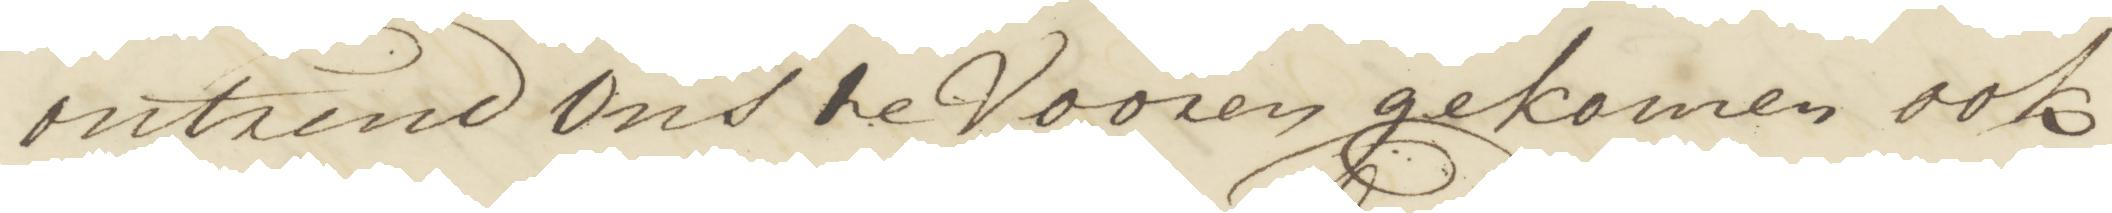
ontrend Ons te vooren gekomen ook
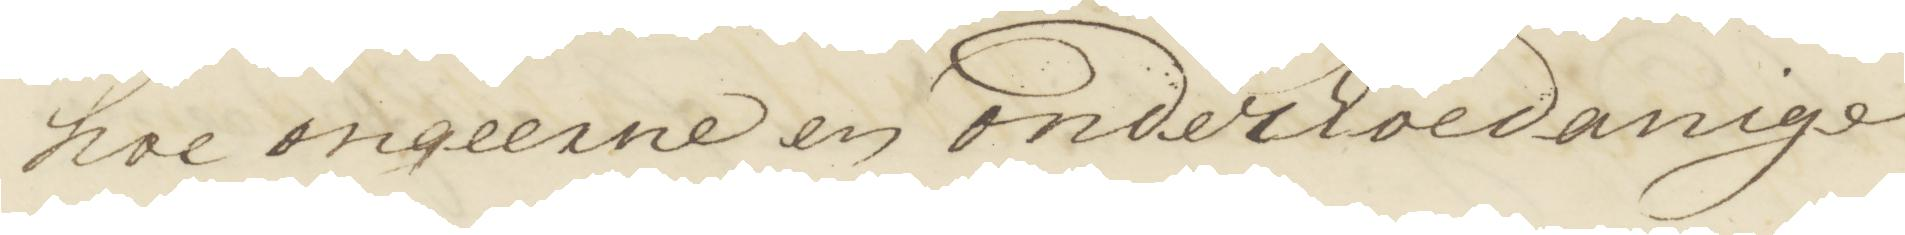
hoe ongeerne en onder hoedanige
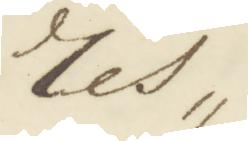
res„
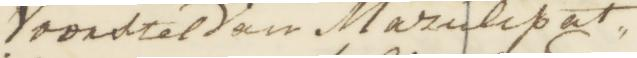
Voorstel van Mazulipat„
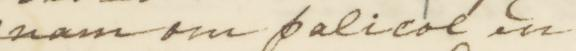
nam om palicol en
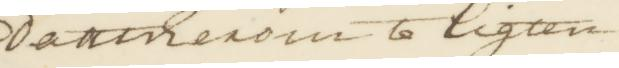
daatcherom te ligten
